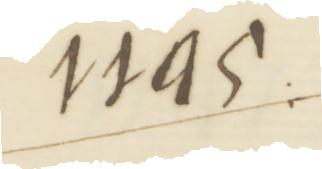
1145.
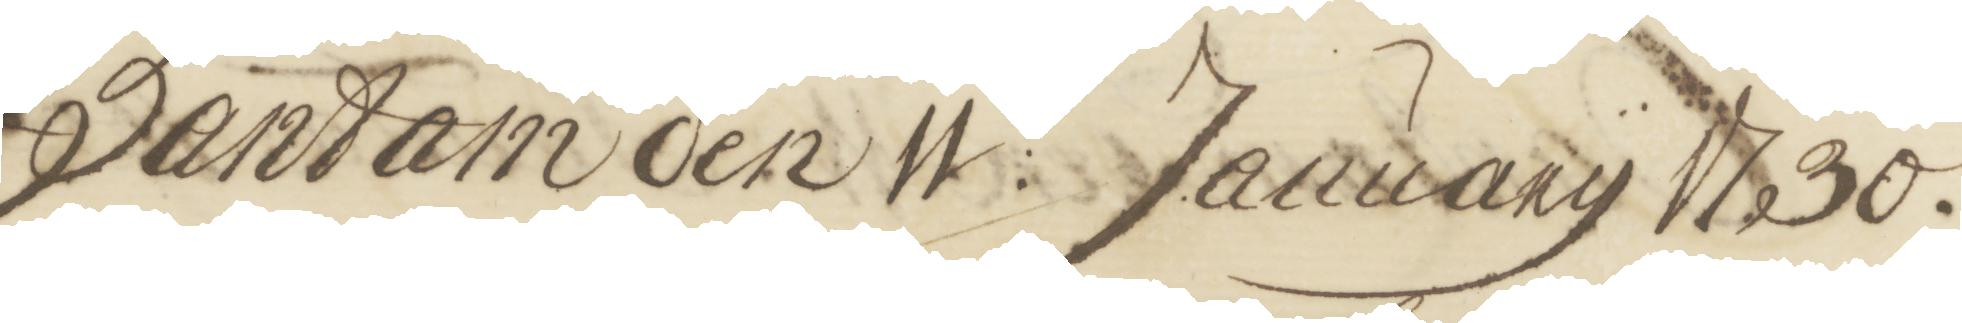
Bantam den 11: Januarij 1730.
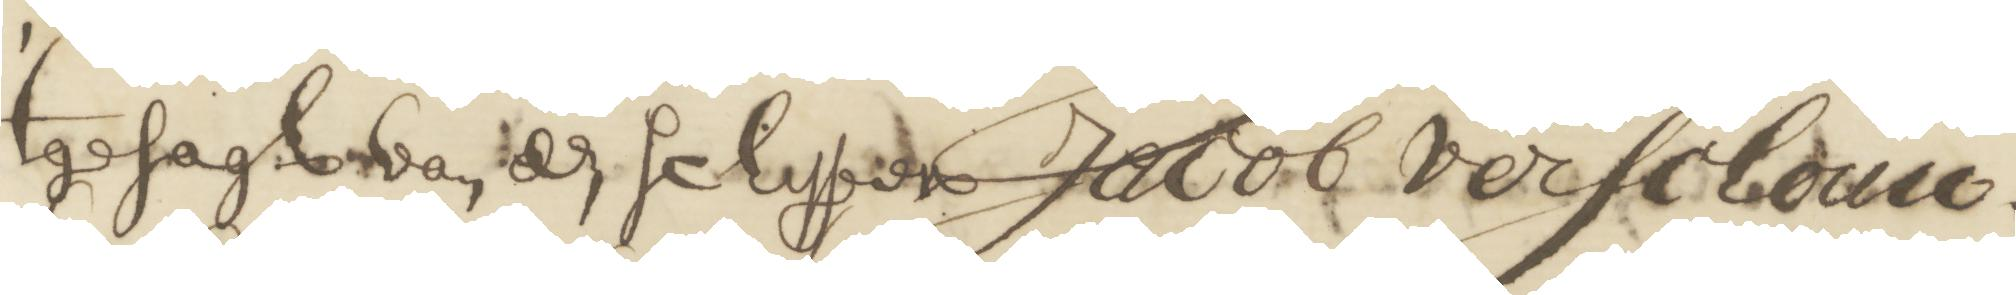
'tgesagh van den schipper Jacob Verschouu
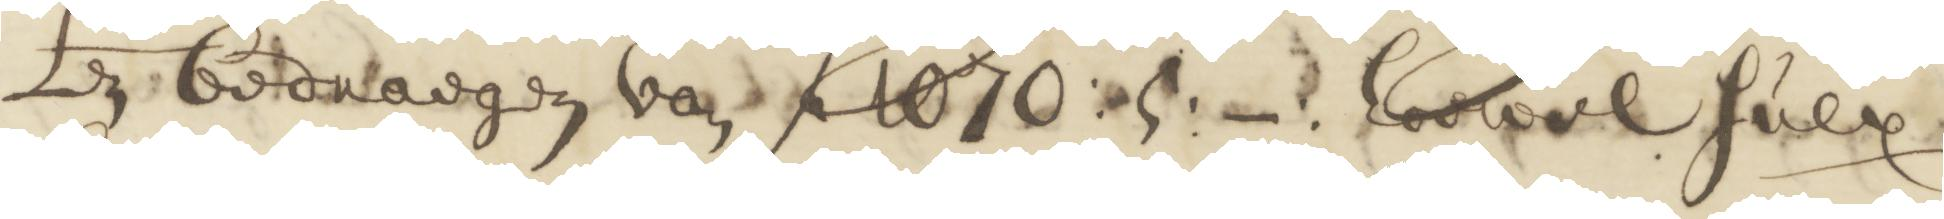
ten bedraegen van ƒ1070:5:-: hoewel sulx
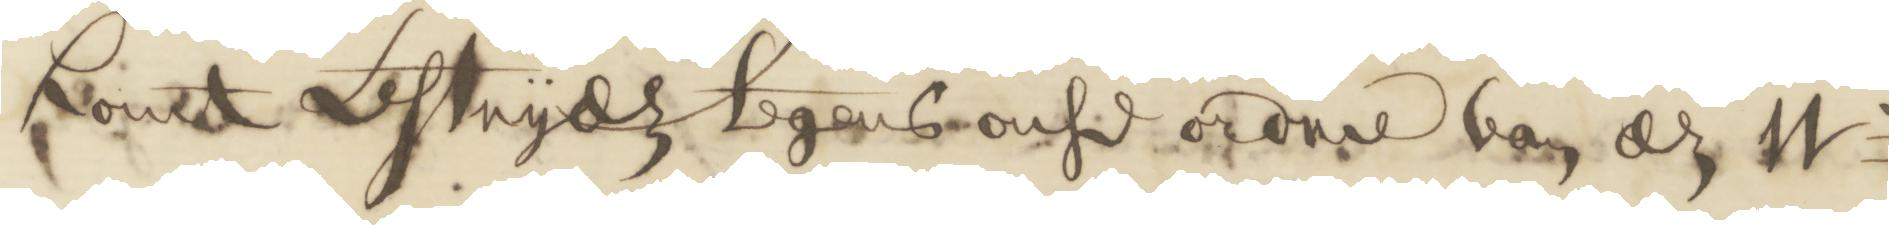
komt testrijden tegens onse ordre van den 11=en
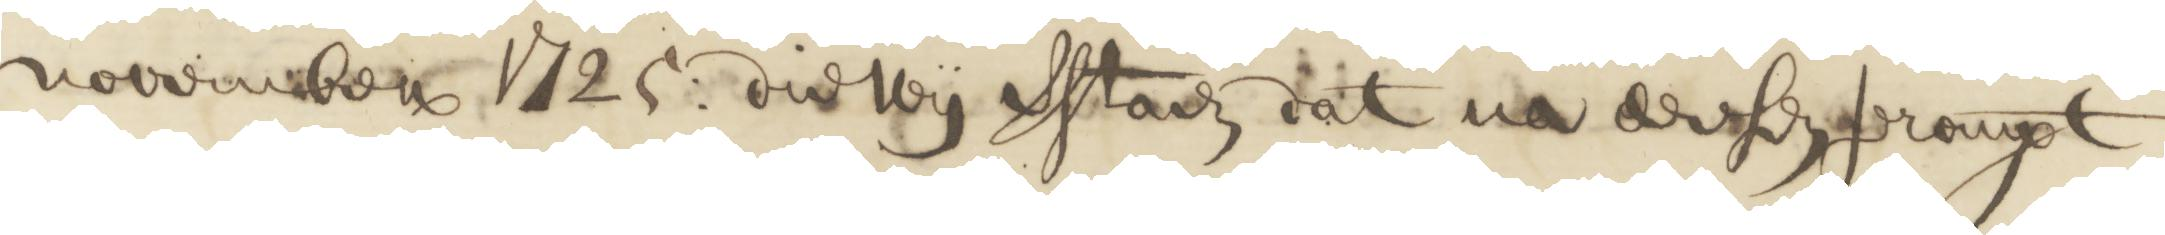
november 1725: die wij verstaen dat na deesen prompt
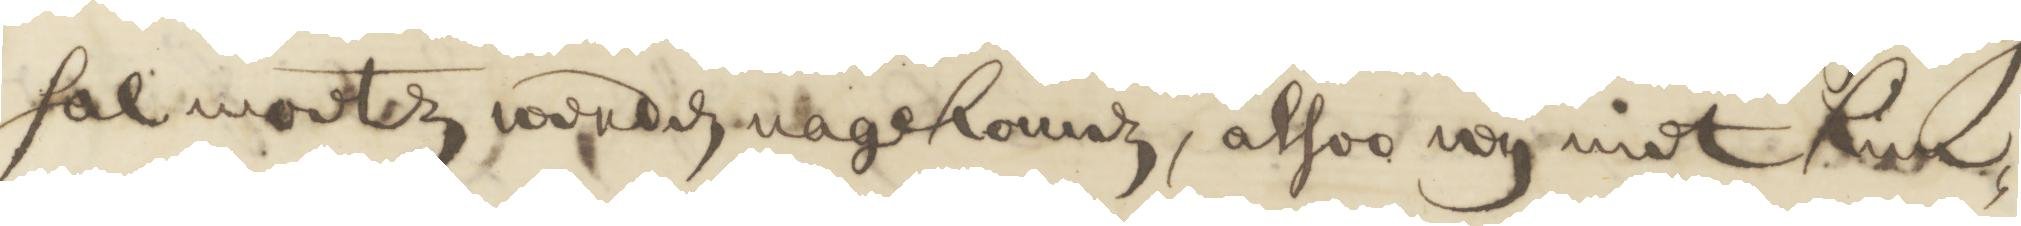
sal moeten werden nagekomen, alsoo wij niet kun„
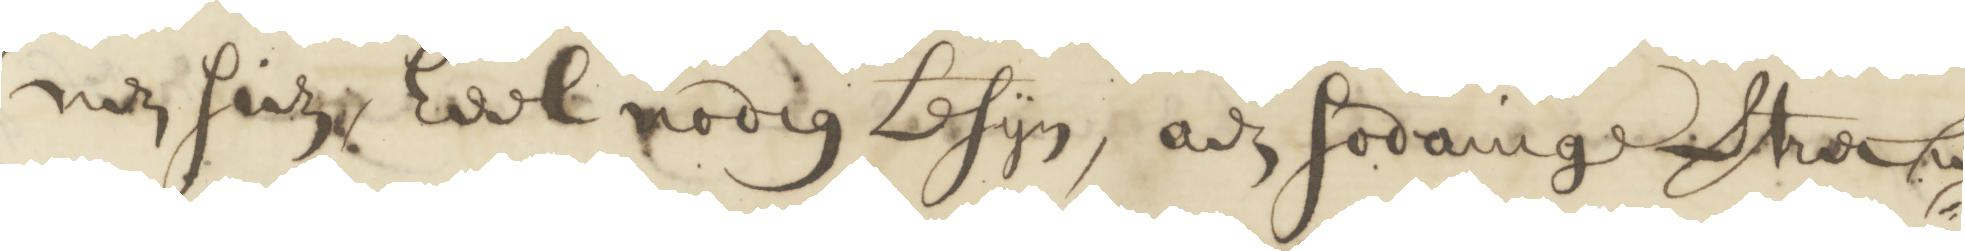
nen sien, heel nodig tesijn, aen sodanige vertrecken„
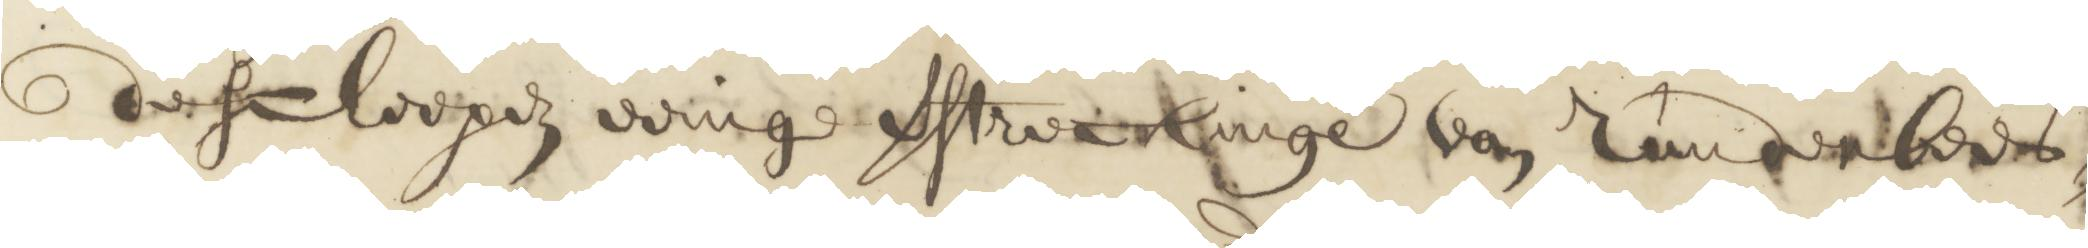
de scheepen eenige verstreckinge van runder bees„
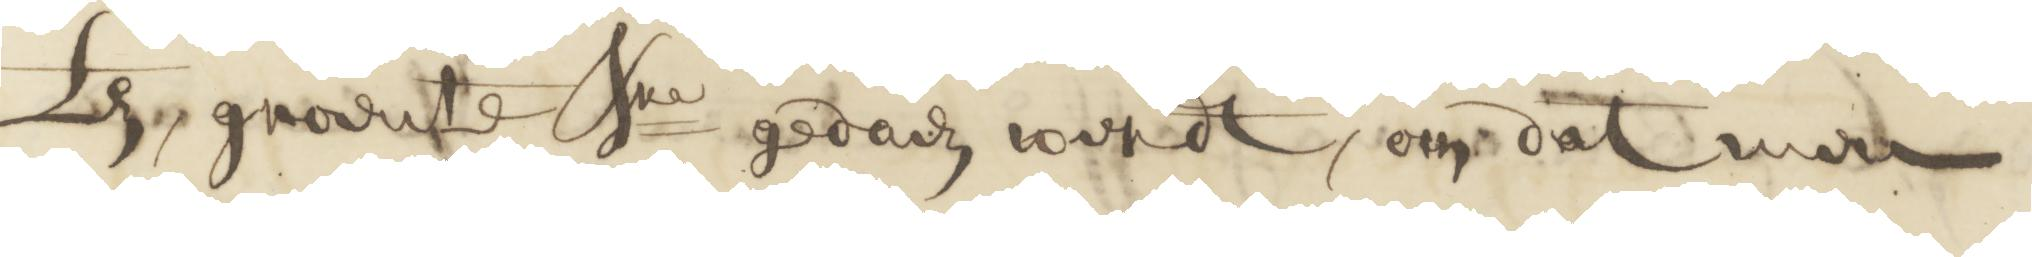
ten, groente E=ra gedaen werdt, om dat men
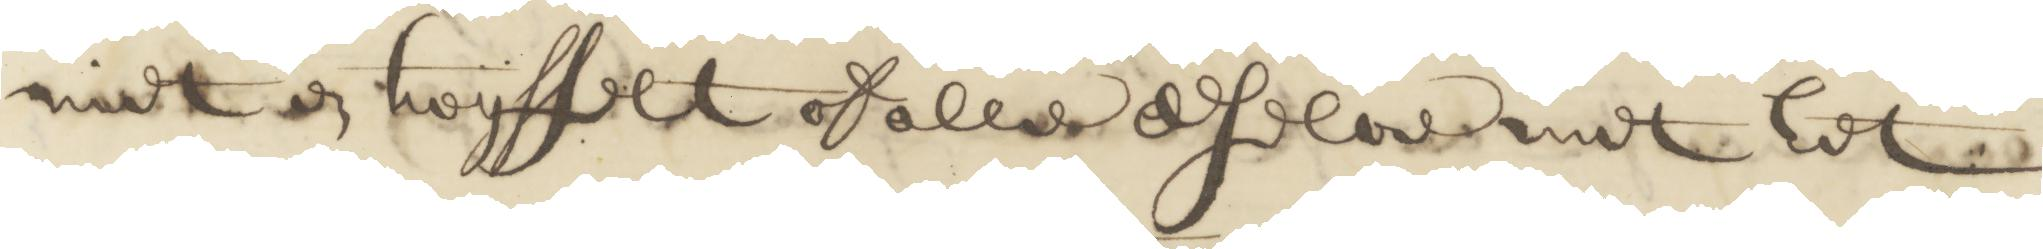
niet en twijffelt of alle deselve met het
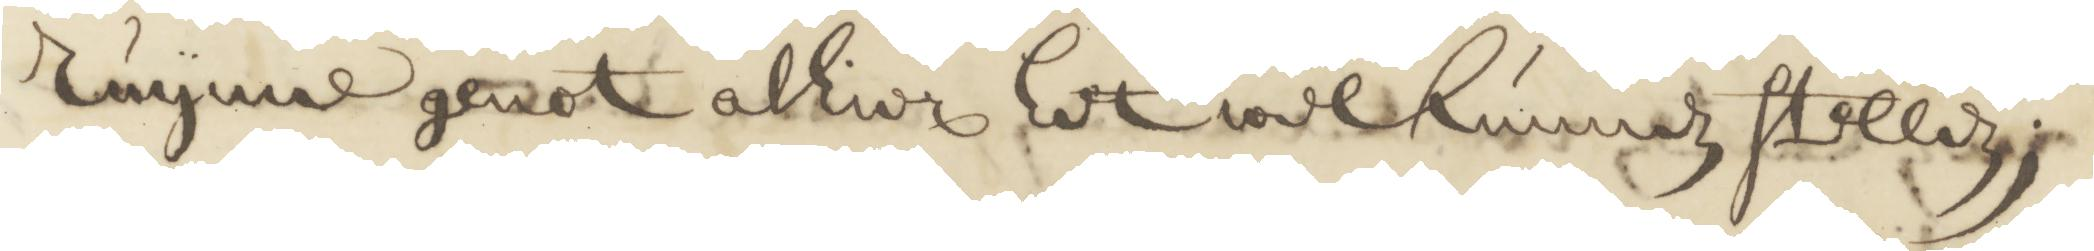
ruijme genot alhier het wel kunnen stellen;
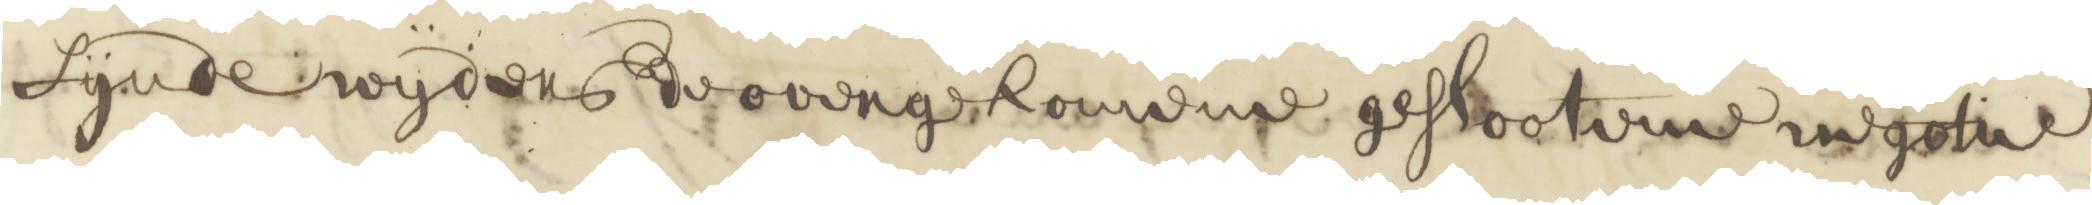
sijnde wijders de overgekomene, geslootene negotie
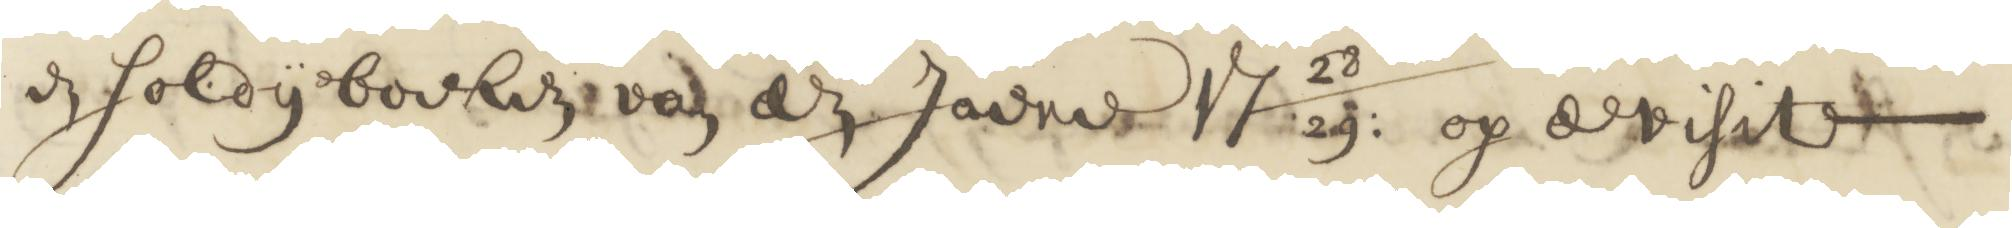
en soldij boeken van den Jaere 17 28/29: op de visite
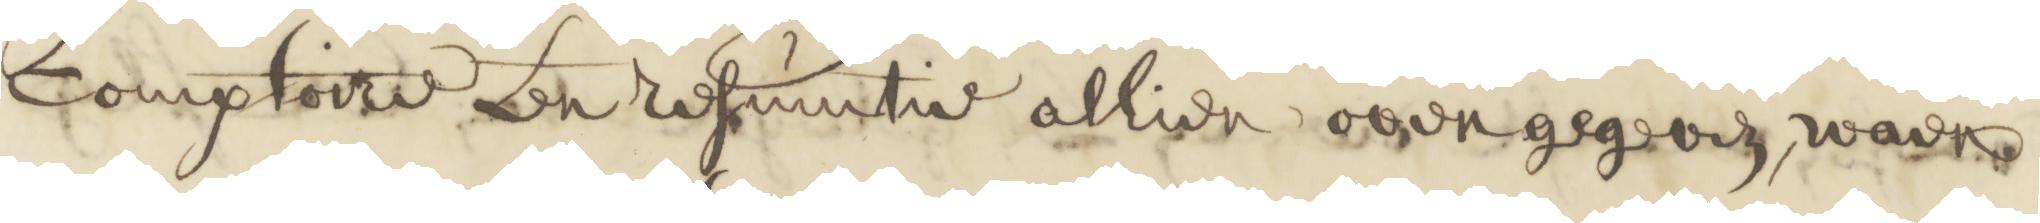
Comptoire ter resumtie alhier, over gegeven, waer
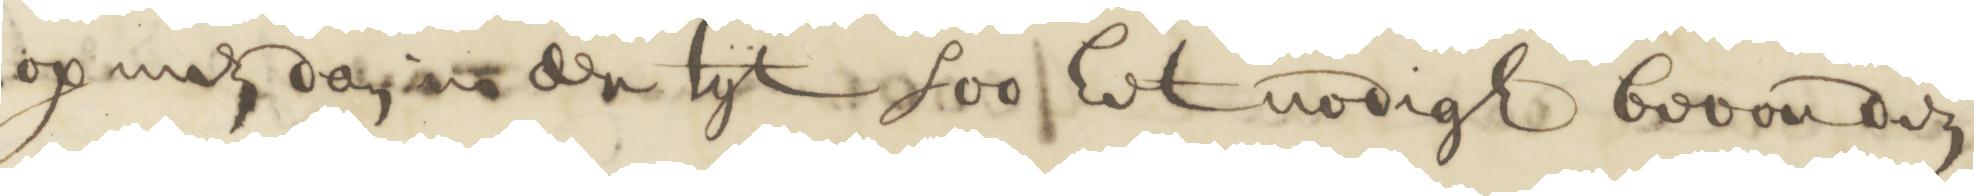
op men dan in der tijt soo het nodigh bevonden
